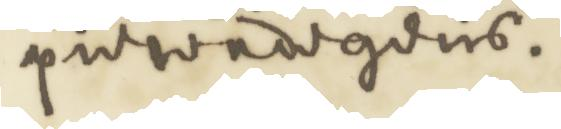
pieter de geus.
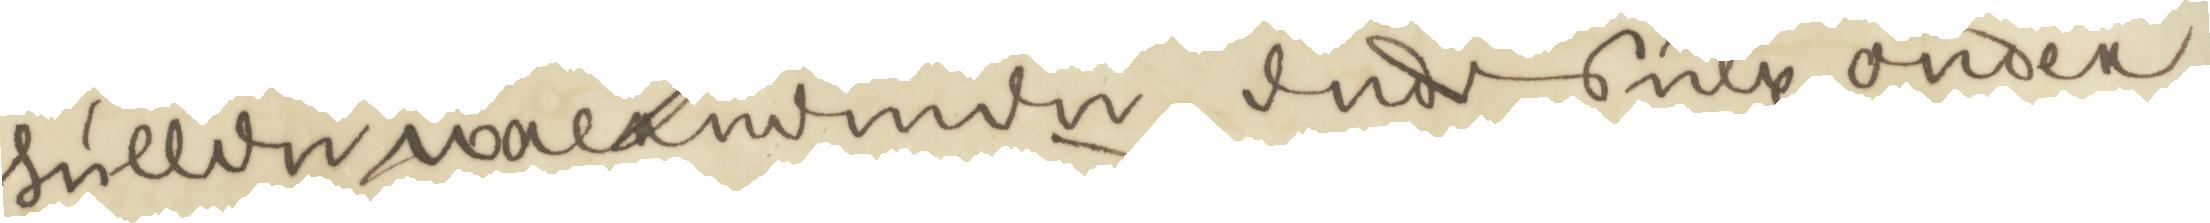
sullen waernemen, ende sulx onder
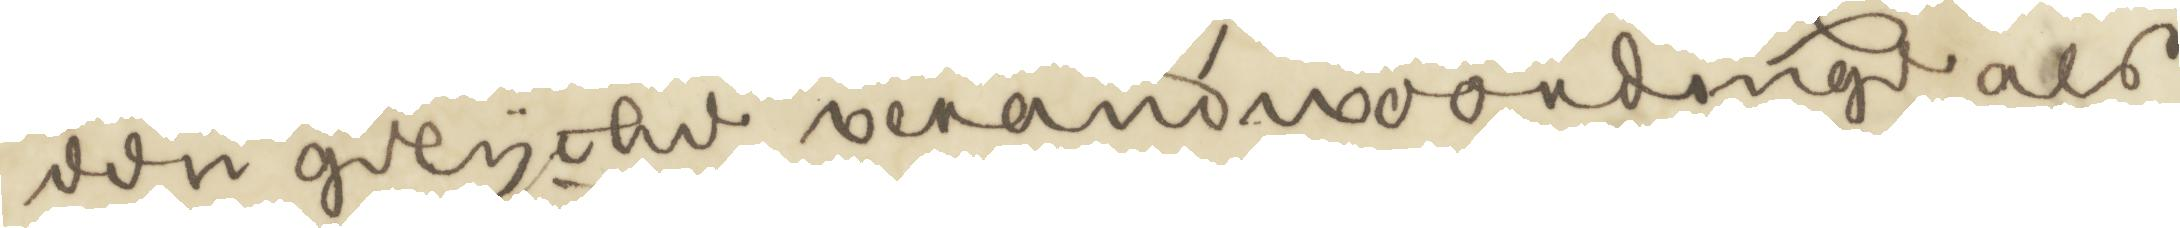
een gelijcke verandwoordinge als
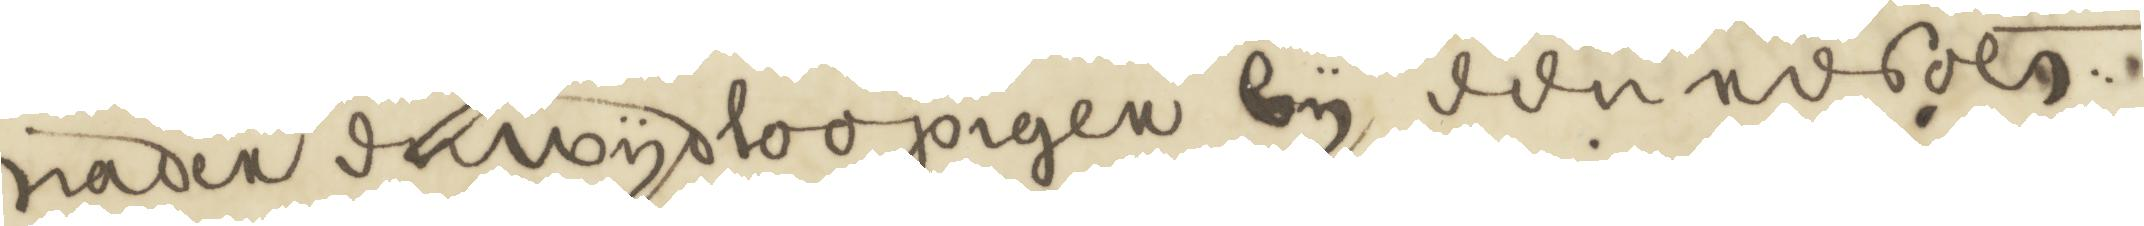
nader enwijd loopiger bij een resol:
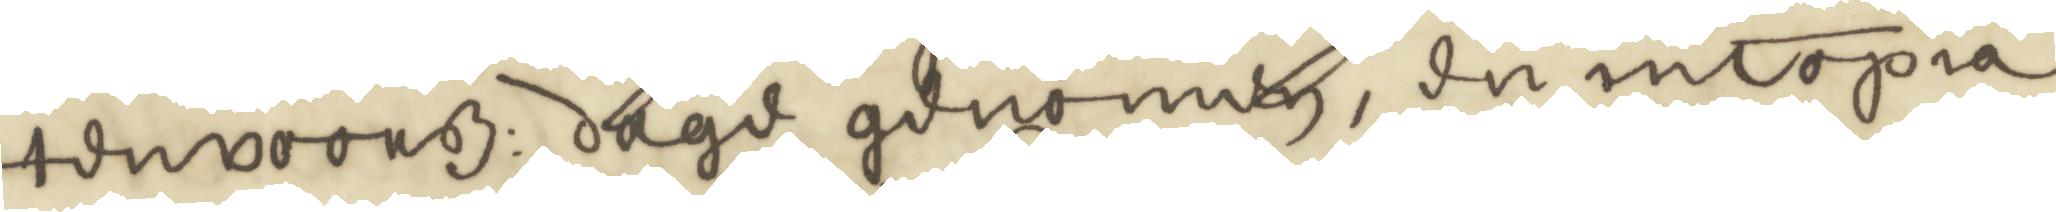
ten voors: dage genomen, en inCopia
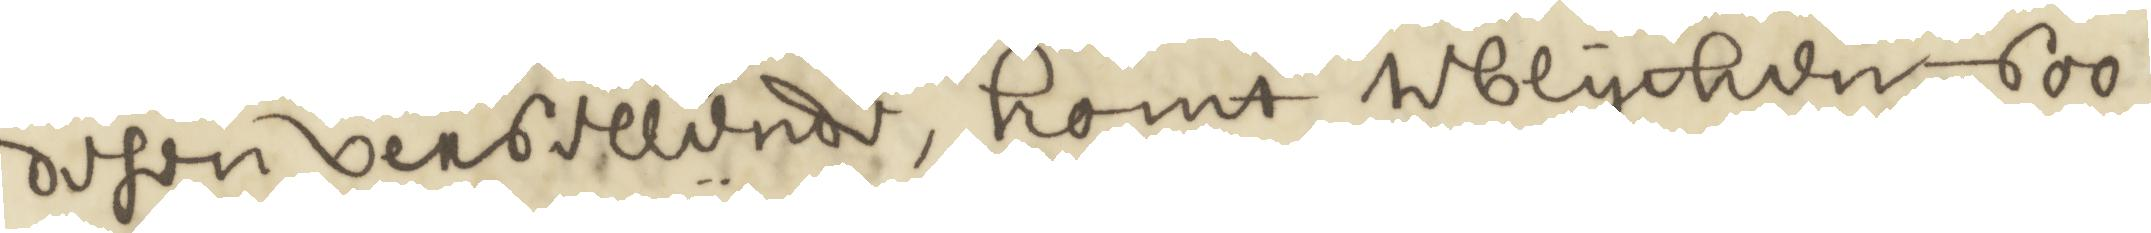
desen versellende, komt teblijcken, soo
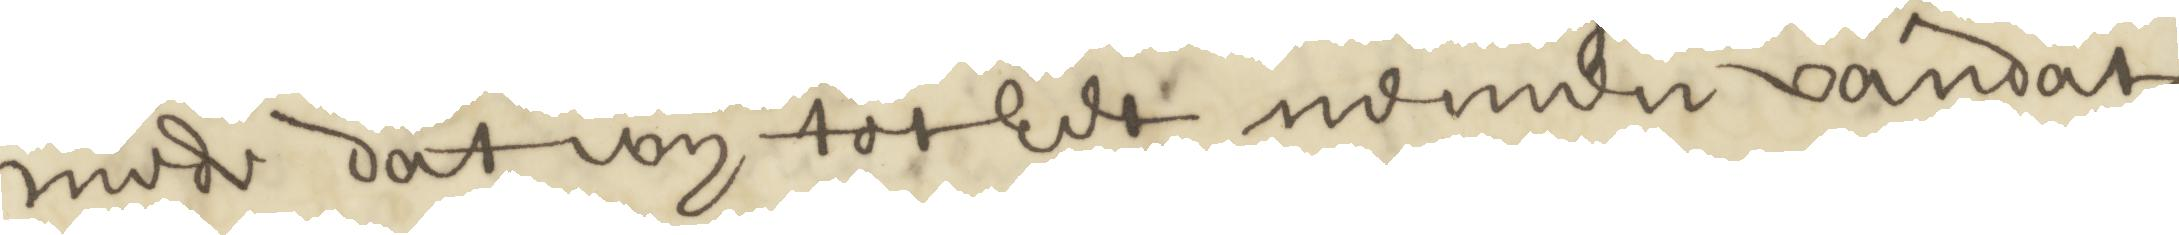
mede dat wij tot het nemen vandat
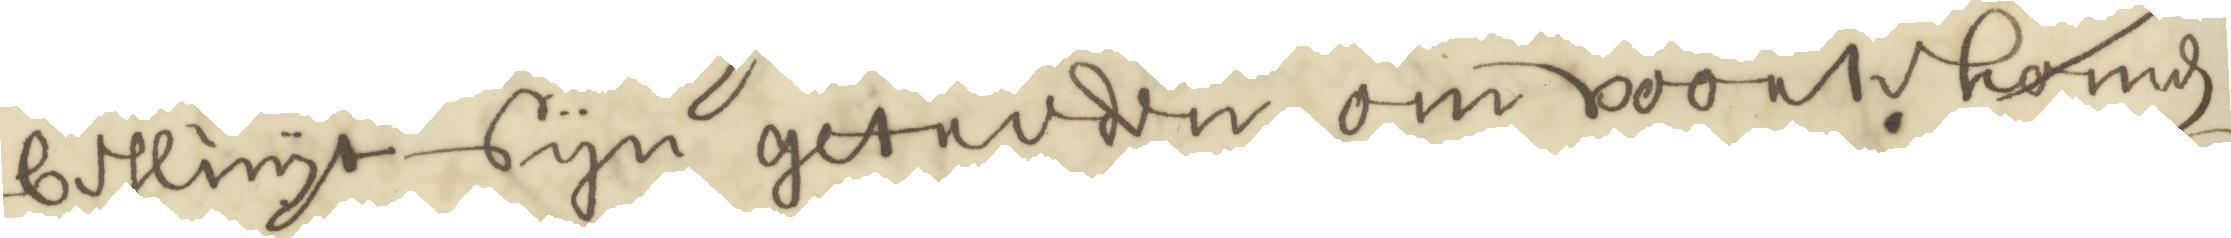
besluijt sijn getreden, om voorte komen
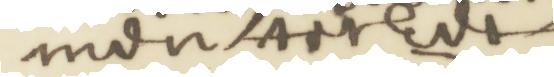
men tot het
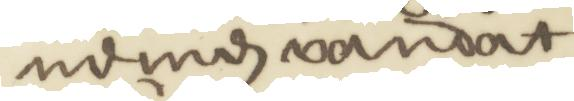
nemen van dat
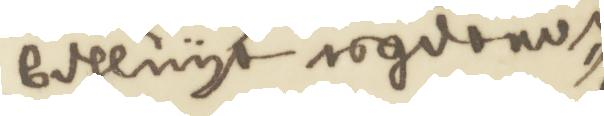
besluijt is getre„
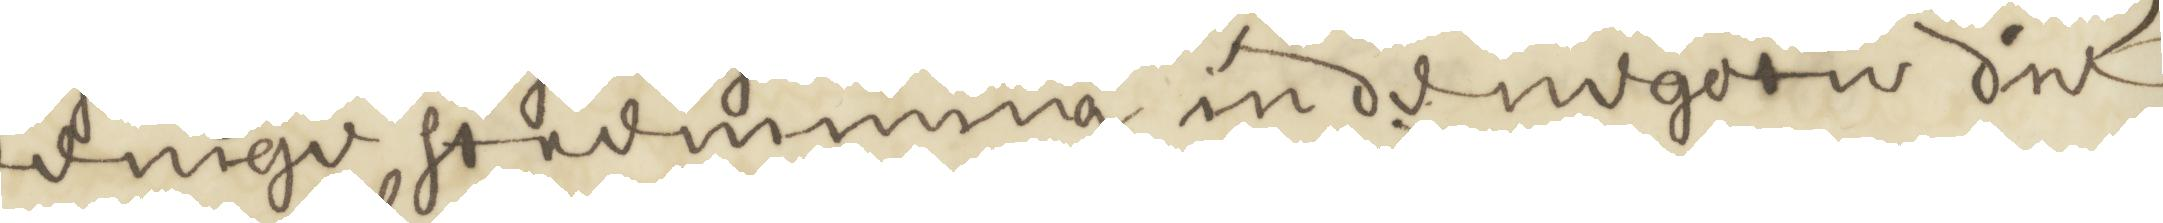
eenige stremming in de negotie die
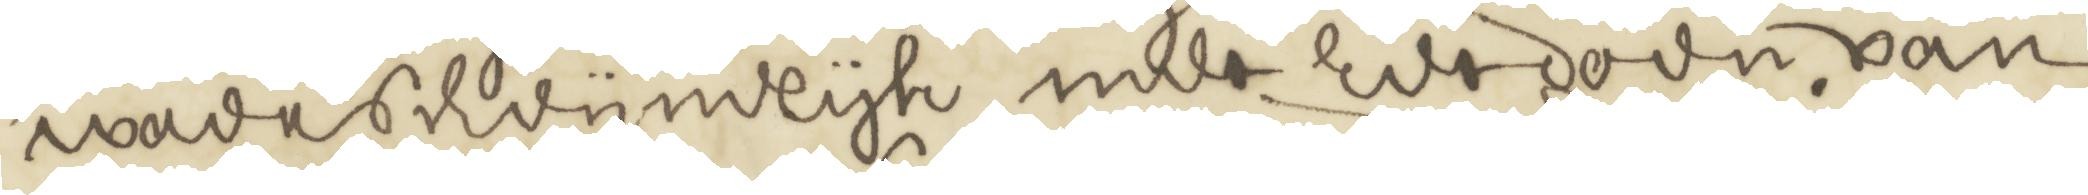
waerscheijnelijk met het doen van
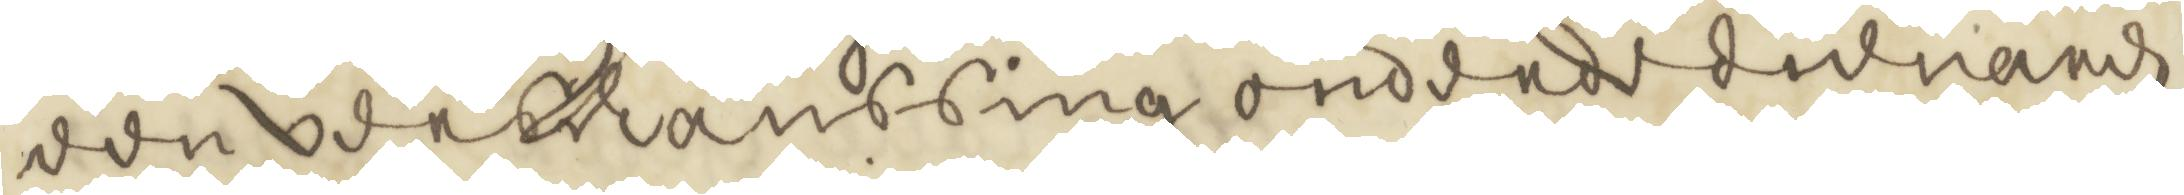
een verschanssing onder de dienaren
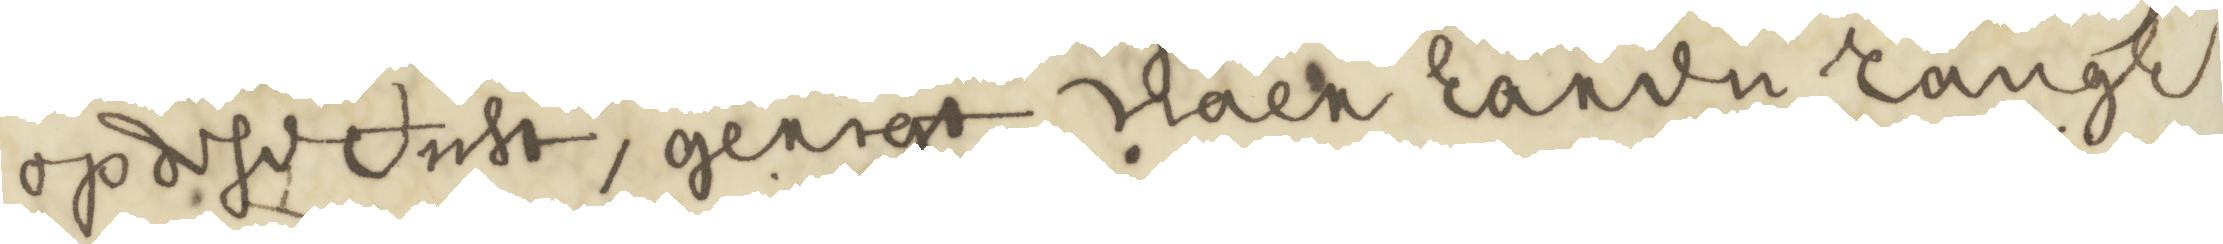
op dese Inst, gerigt naer haren, rangh
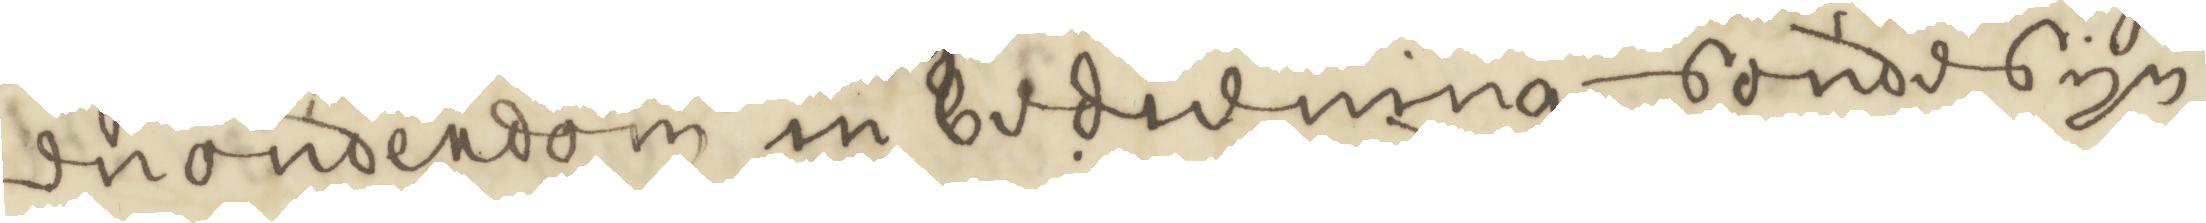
en ouderdom in bediening soude sijn
